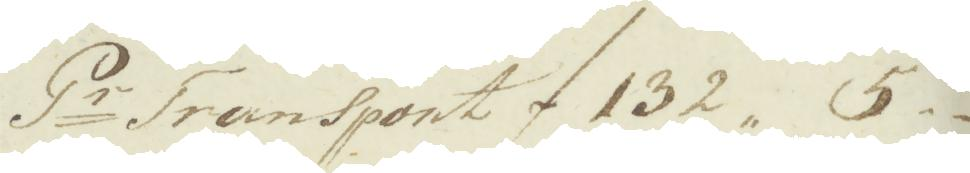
P„r Transport ƒ 132„ 5 „ -
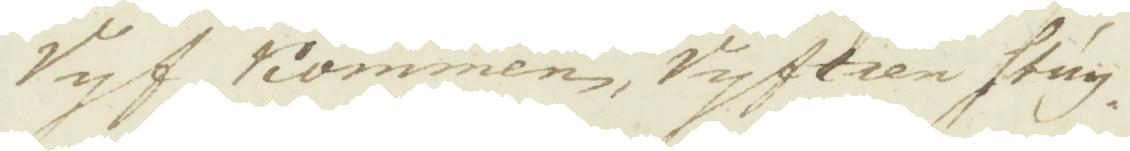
Vyf Kommen, Vyftien stuij„
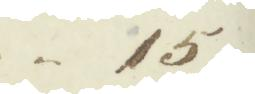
„ 15 . .
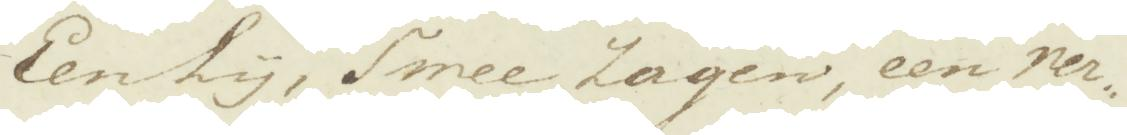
Een Lij, Twee Zagen, een ver„
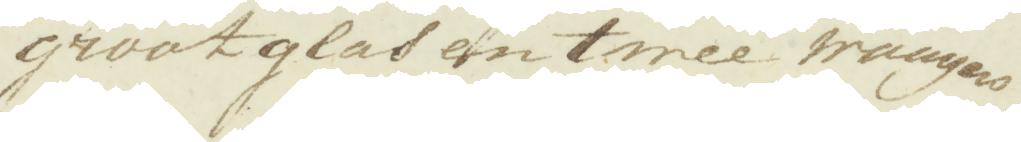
groot glas en twee waayers
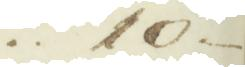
. . 10 —
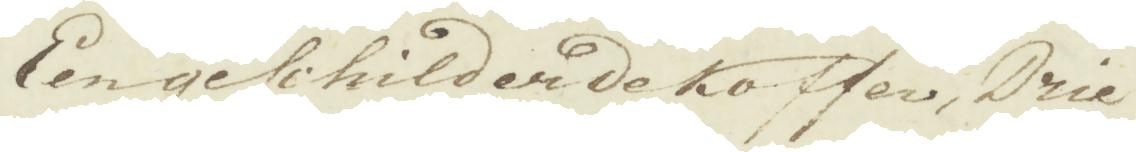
Een geschilderde koffer, Drie
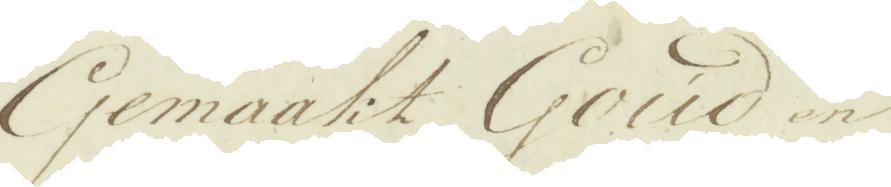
Gemaakt Goud en
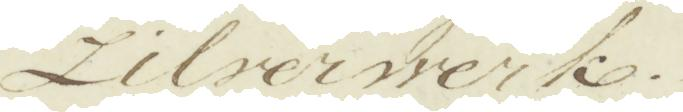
Zilverwerk.
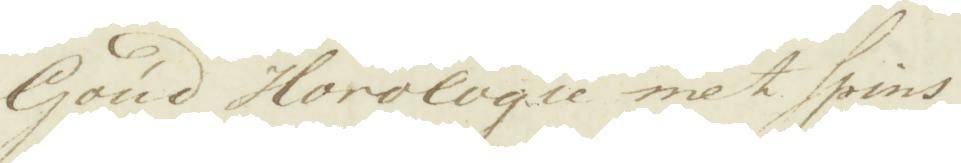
Goud Horologie met spins
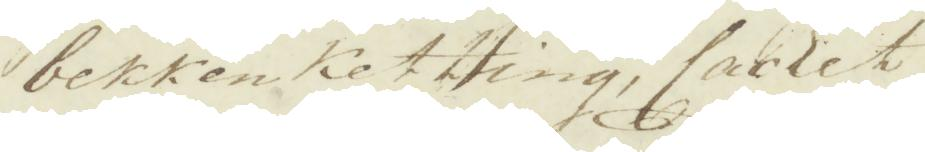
bekken ketting, Cachet
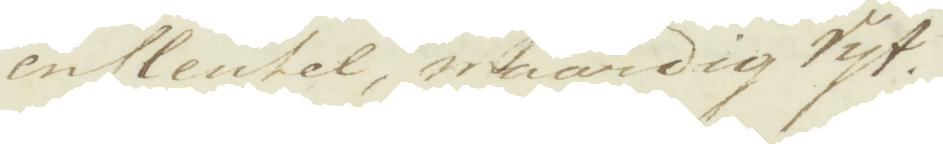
en sleutel, waardig Vijf.
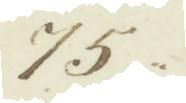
75 „
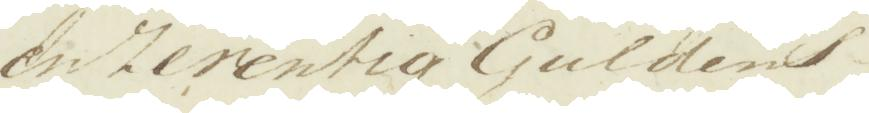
en Zeventig Guldens
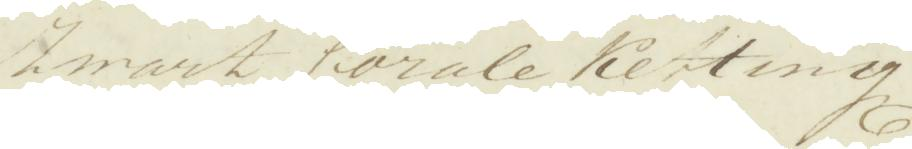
Zwart Corale Ketting
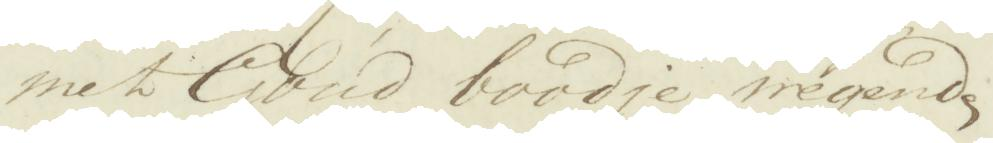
met Goud boodje, wegende
